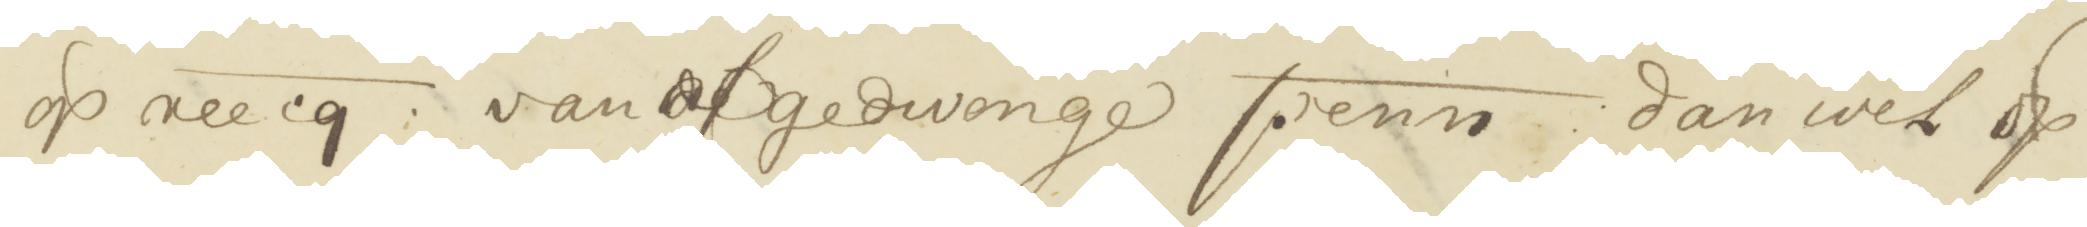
op reecq: van afgedwonge penn: dan wel op
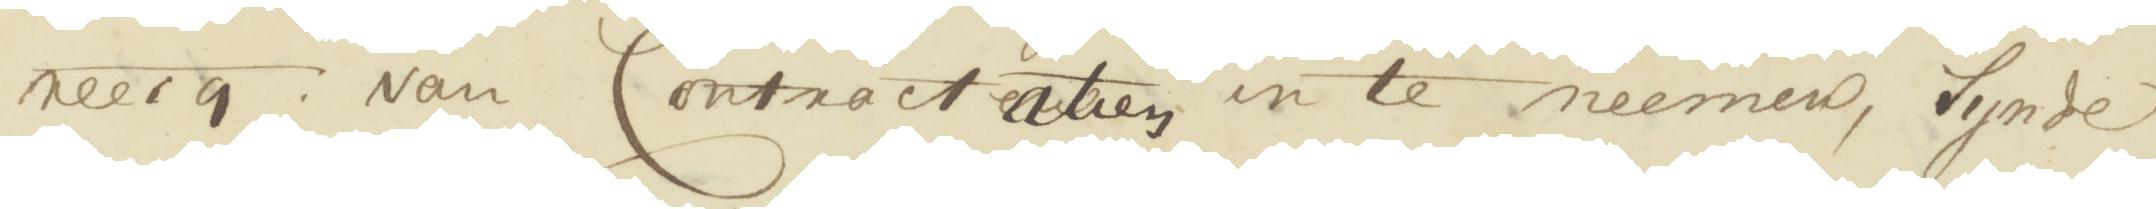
reecq: van Contractatien in te neemen, Synde
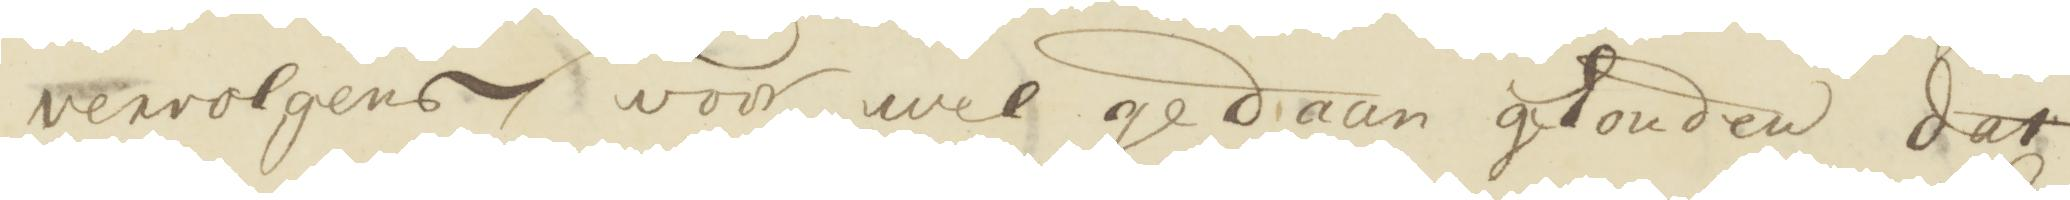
vervolgens, voor wel gedaan gehouden dat
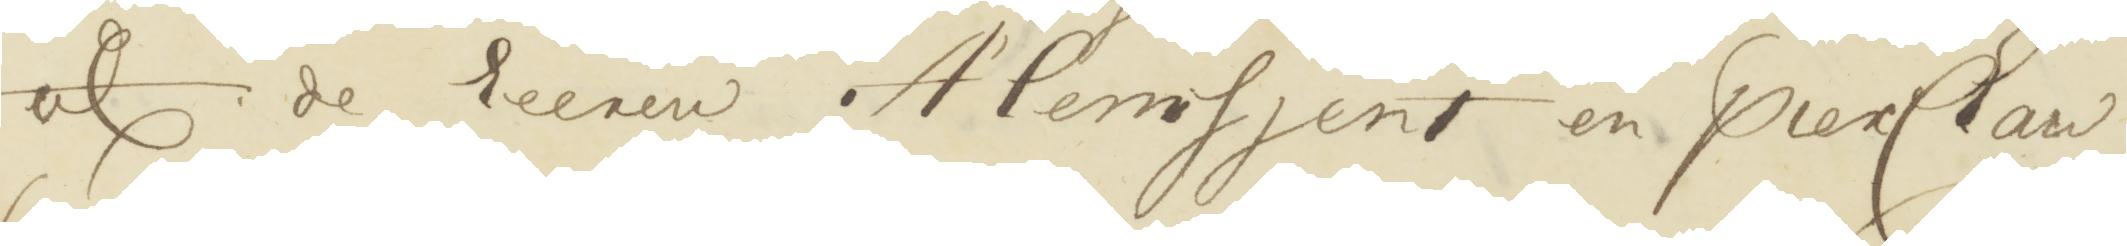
uE: de heeren Alemsjent en Pier Chan
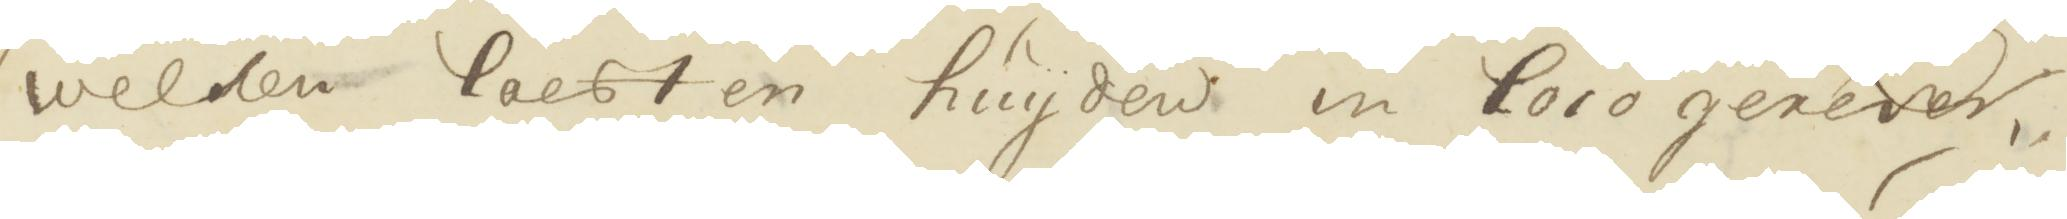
(welken laesten huijden in loco gerever„
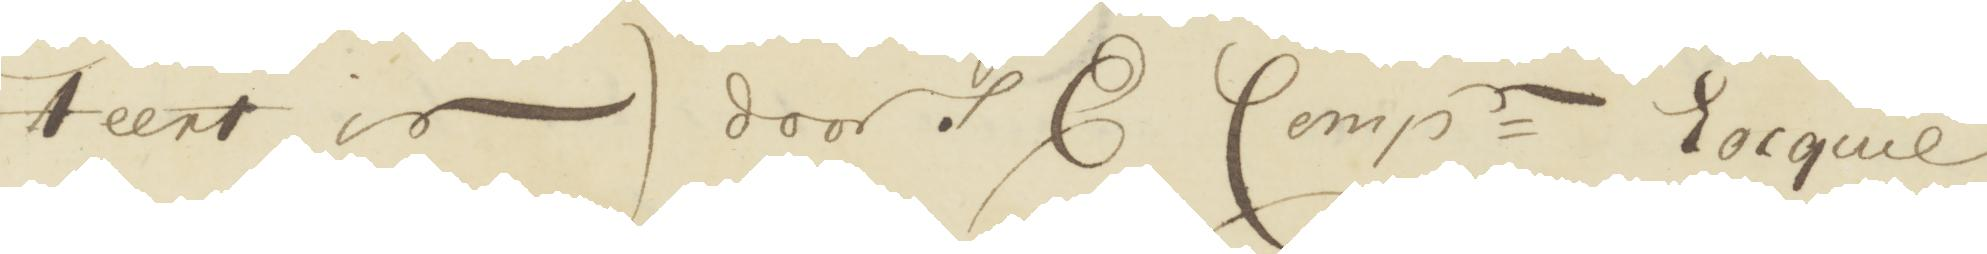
teert is ) door ’S E Comp=s hocquil
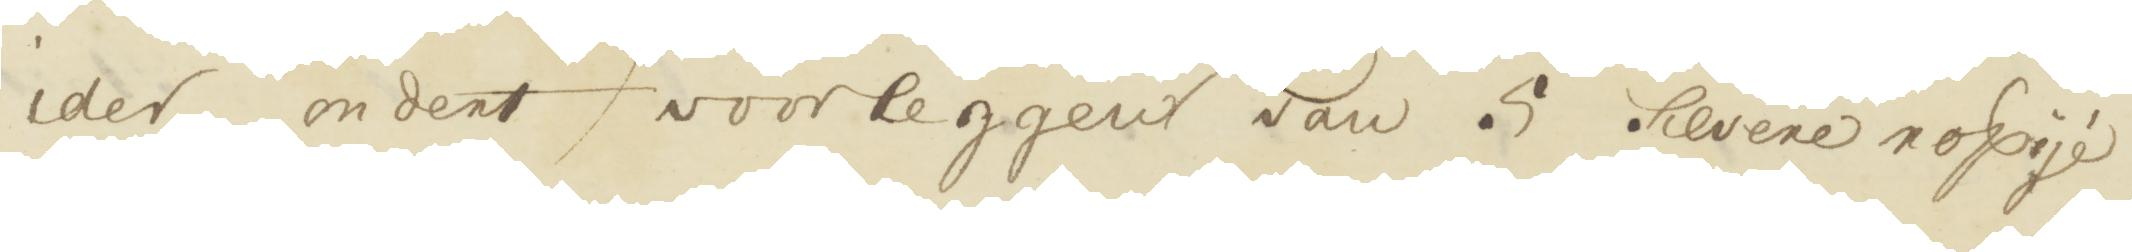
ider onder t voorleggens van 5 silvere ropijé
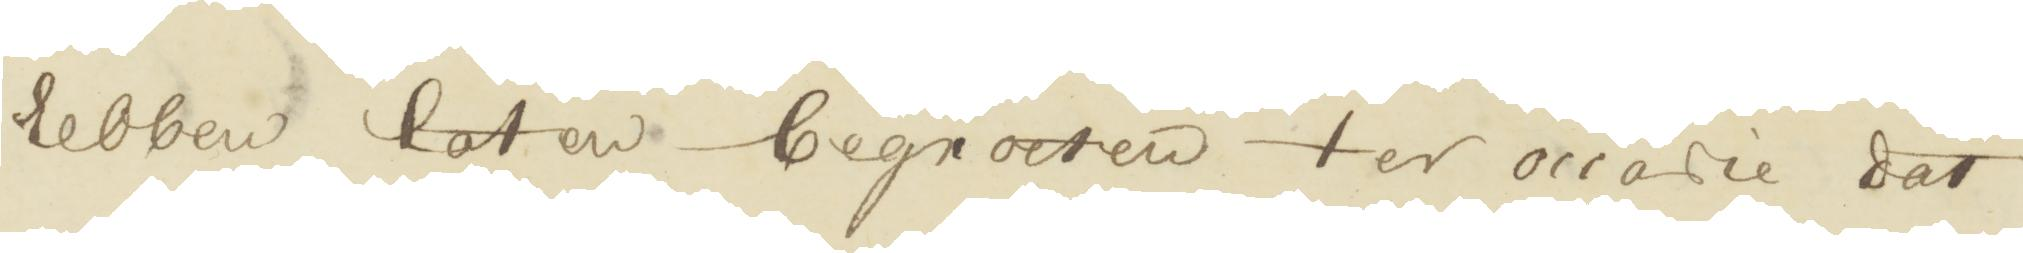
hebben laten begroeten ter occasie dat
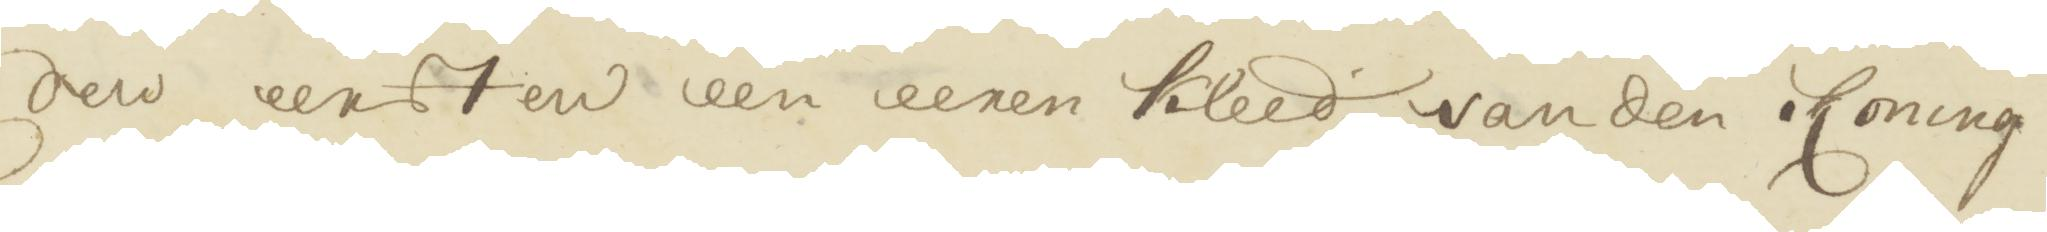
den eersten een eeren kleed van den koning
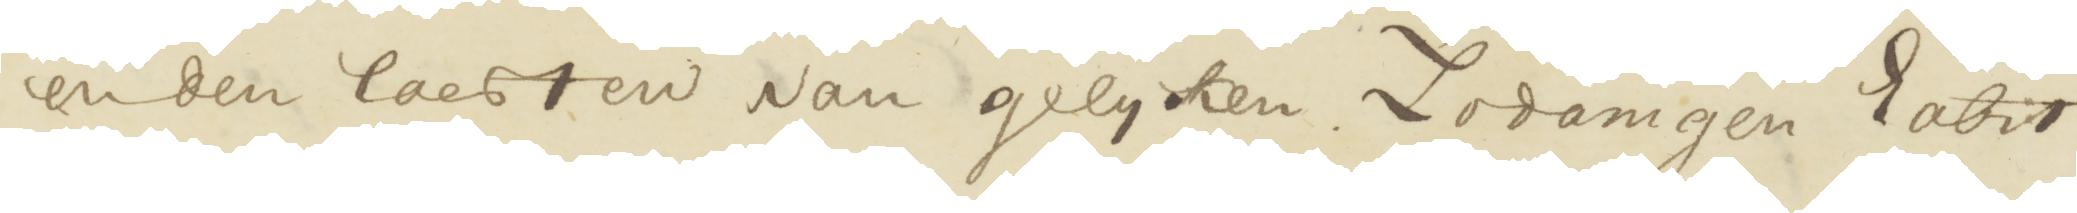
en den laesten van gelyken, Zodanigen habit
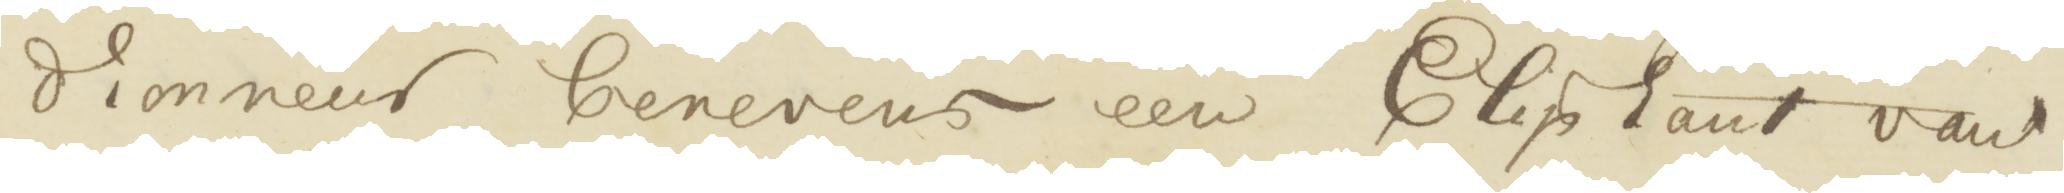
d'honneur benevens een Elephant van
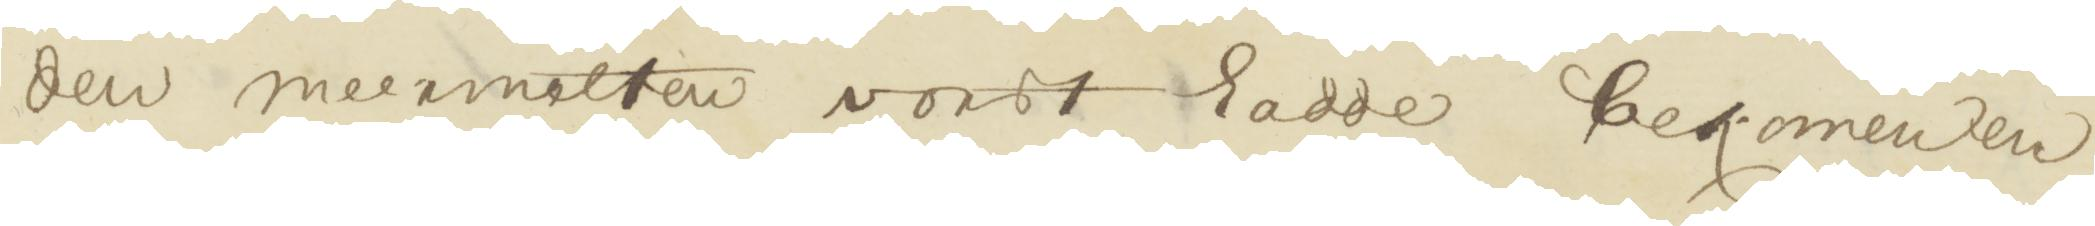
den meermelten vorst hadde bekomen en
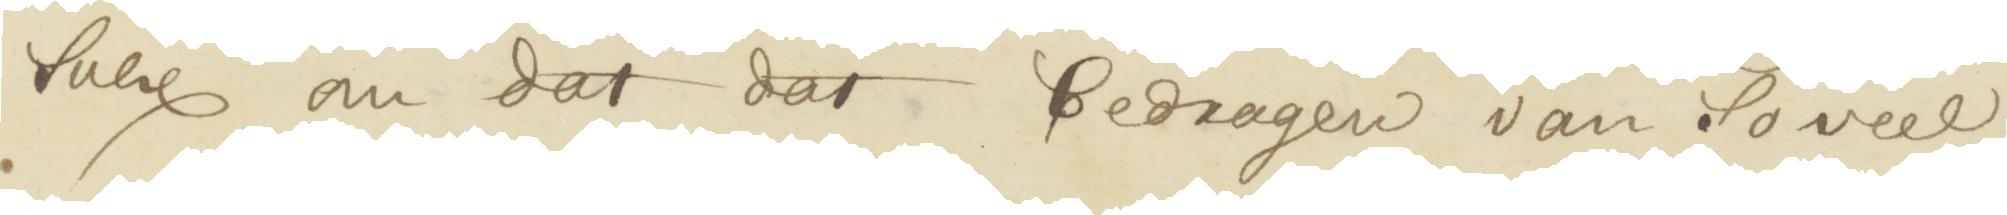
sulx om dat dat bedragen van So veel
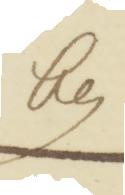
be
